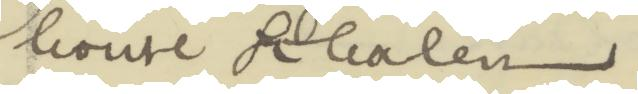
houte schelen
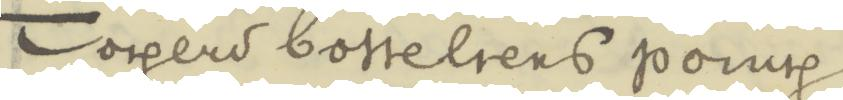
Copere botteliers pomp
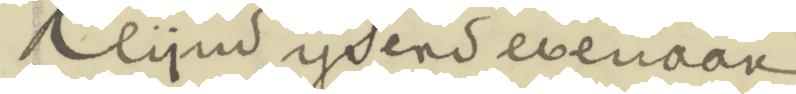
Klijne ijsers evenaar
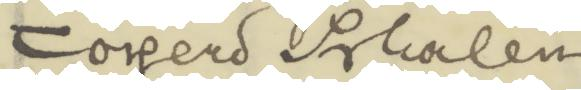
Copere schalen
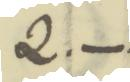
2 . – .
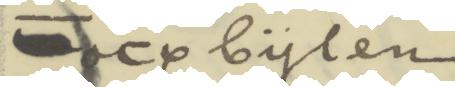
Cocxbijlen
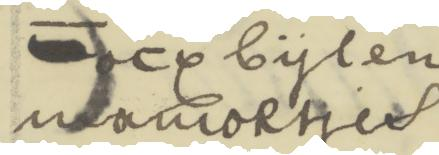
mamoetjes
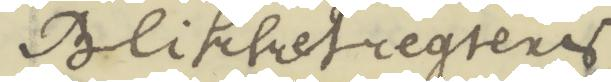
Blikketregteres
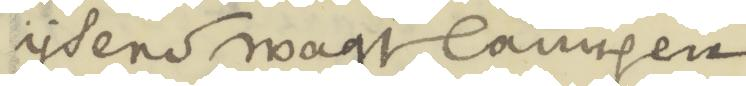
ijsere wagtlampen
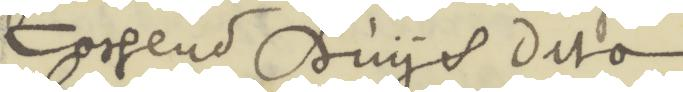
Copere Huijs dito
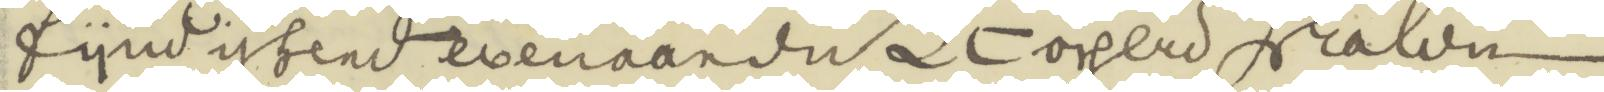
fijne ijsere evenaaren 2 copere schalen
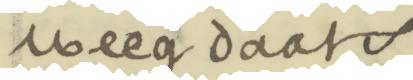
weeg daats
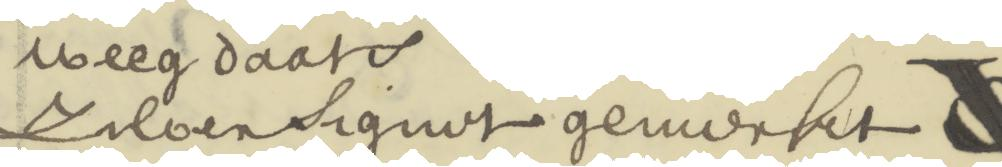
zilversignet gemerkt
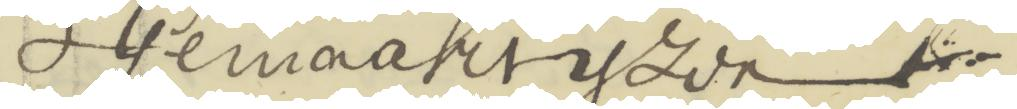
Gemaakt ijzer
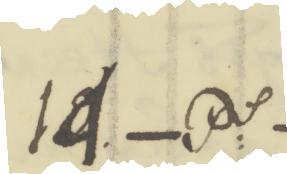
14. – P:s
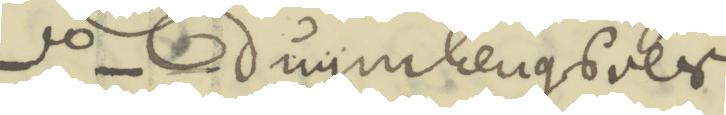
_o – duijmhengsels
